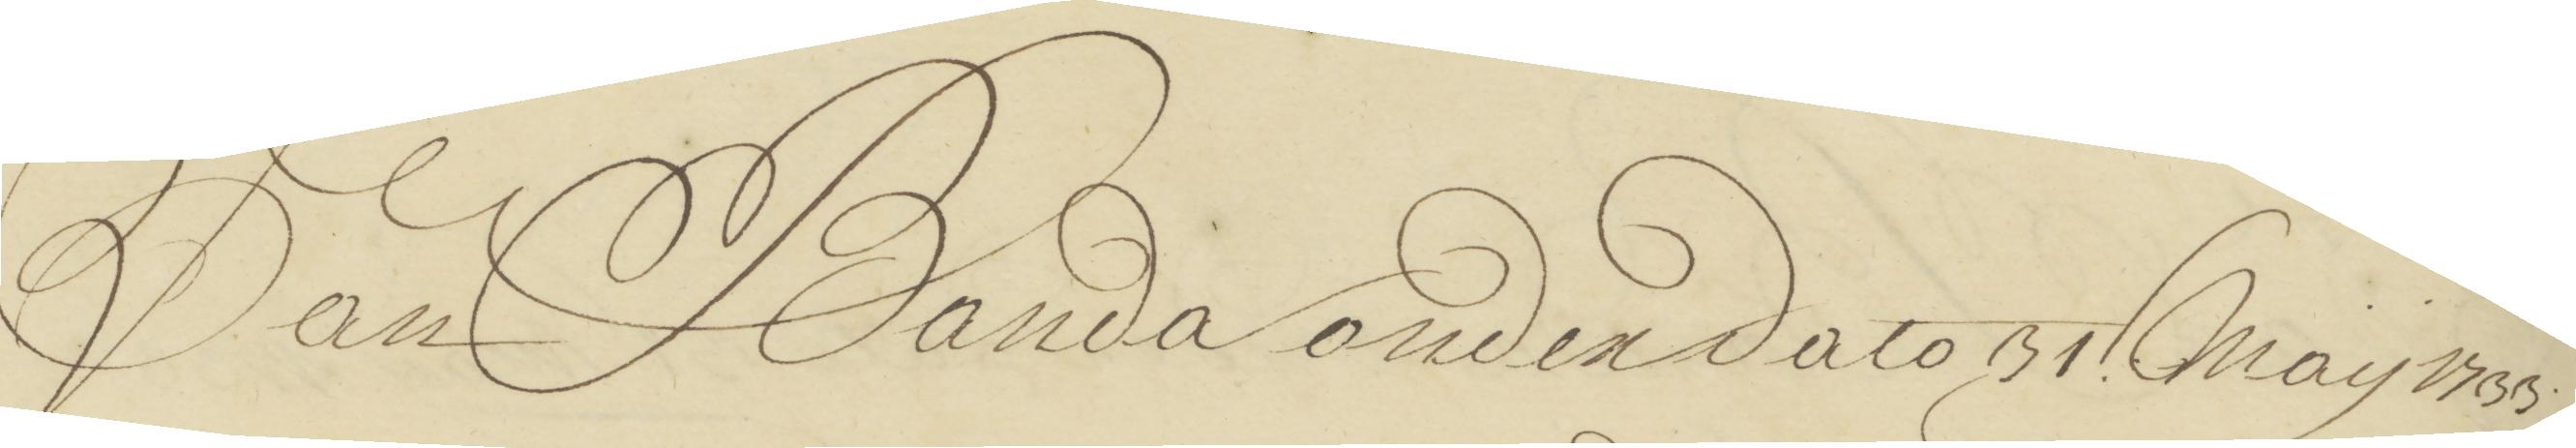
Van Banda onder dato 31: Maij 1733.
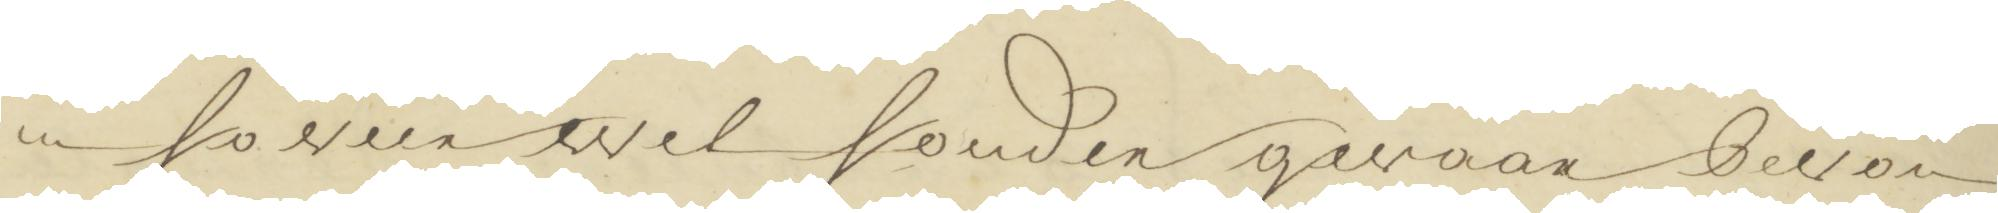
in so veer wel sonder gevaar bevon
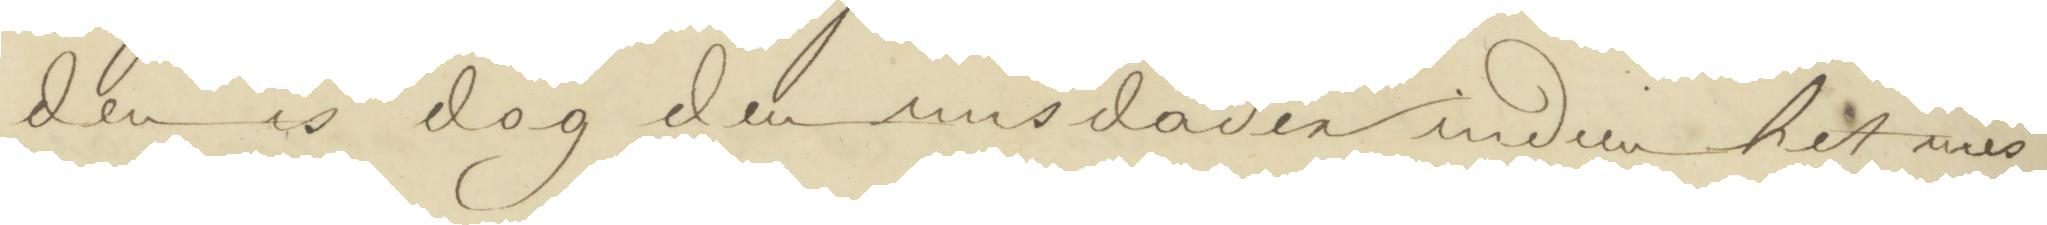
den is dog den misdader indien het mes
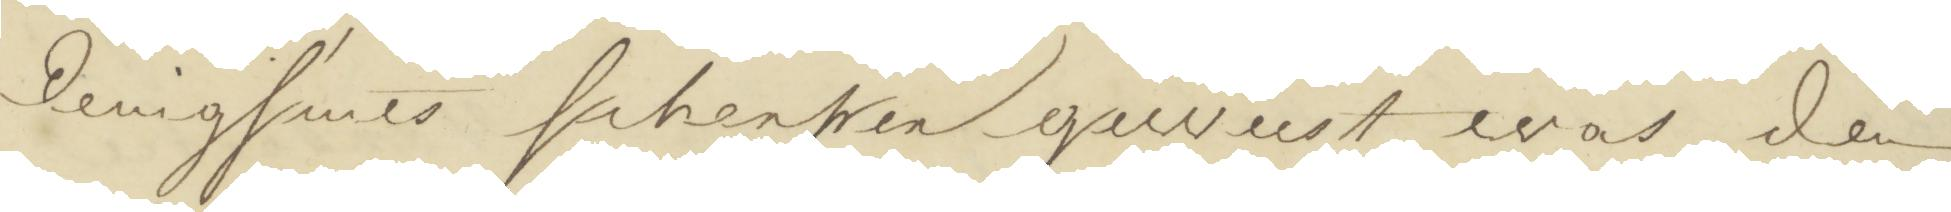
Eenigsints scherper geweest was, den
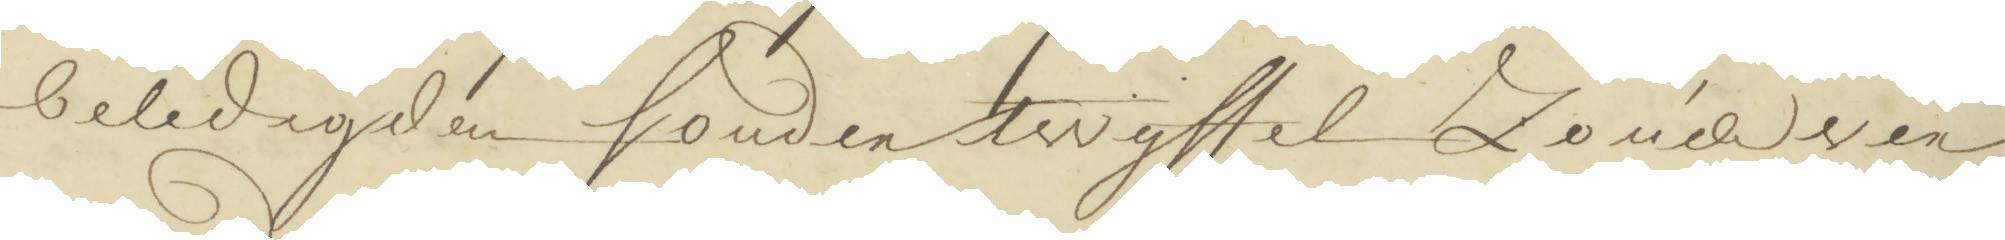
beledigden sonder twijffel Zoude ver
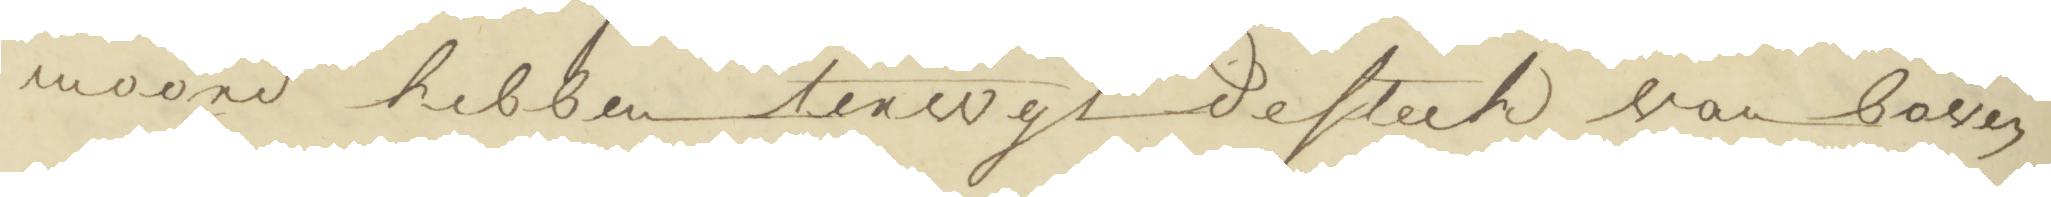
moord hebben terwijl de steek van boven
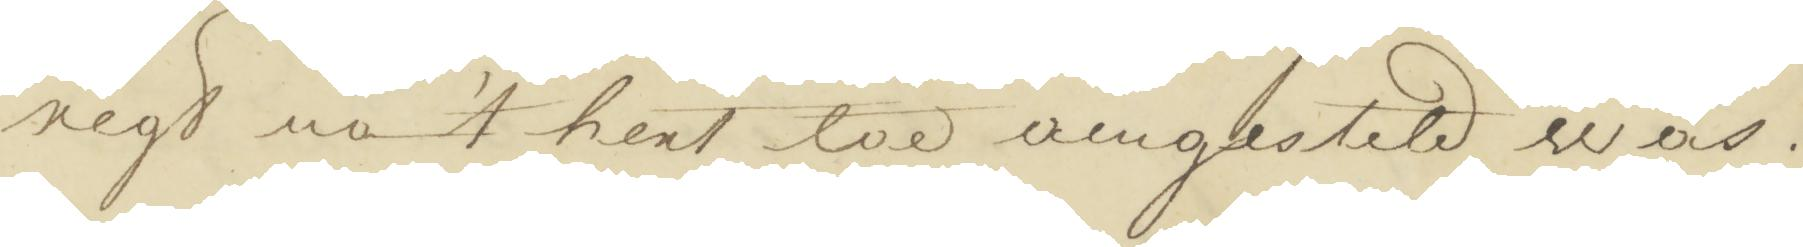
regt na ’t hert toe aengesteld was.
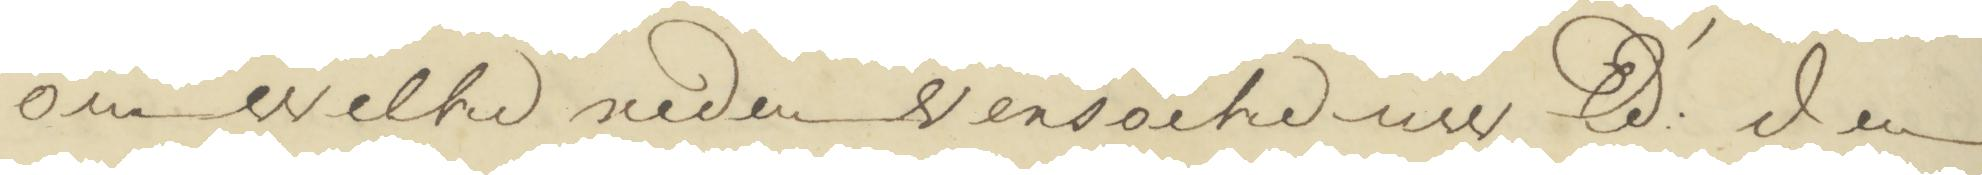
om welke reden versoeke uw Ed: den
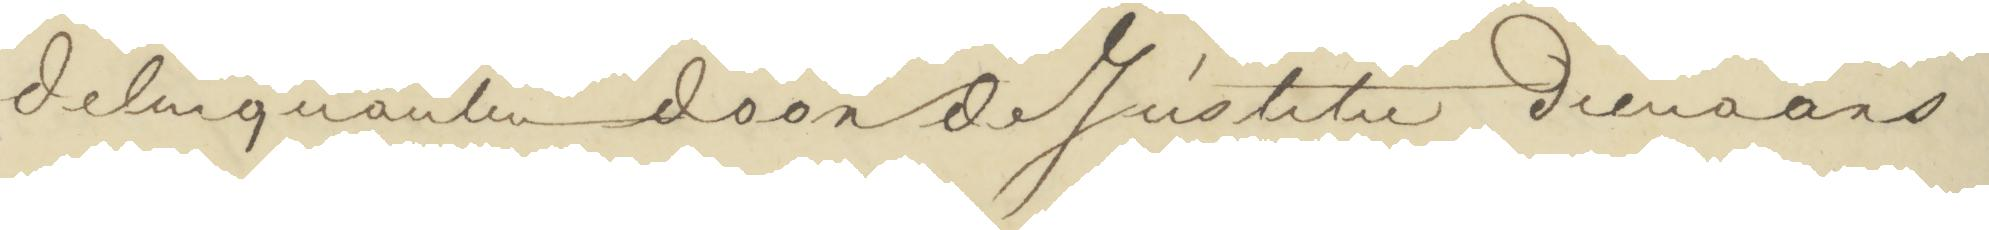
delinquanten door de Justitie dienaars
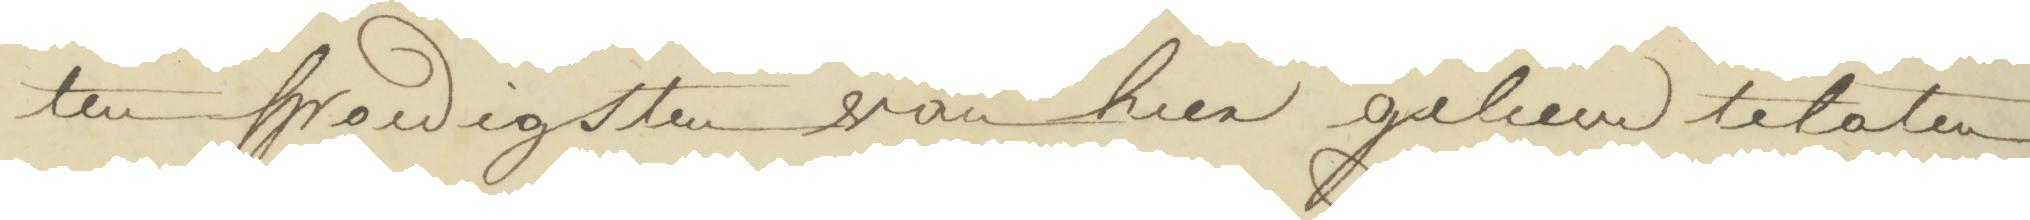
ten spoedigsten van hier gelieve te laten
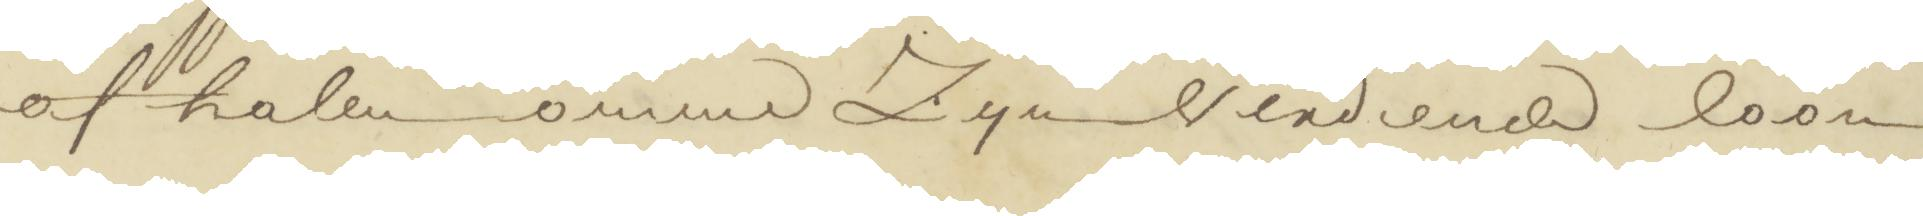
af halen, omme Zijn verdiende loon
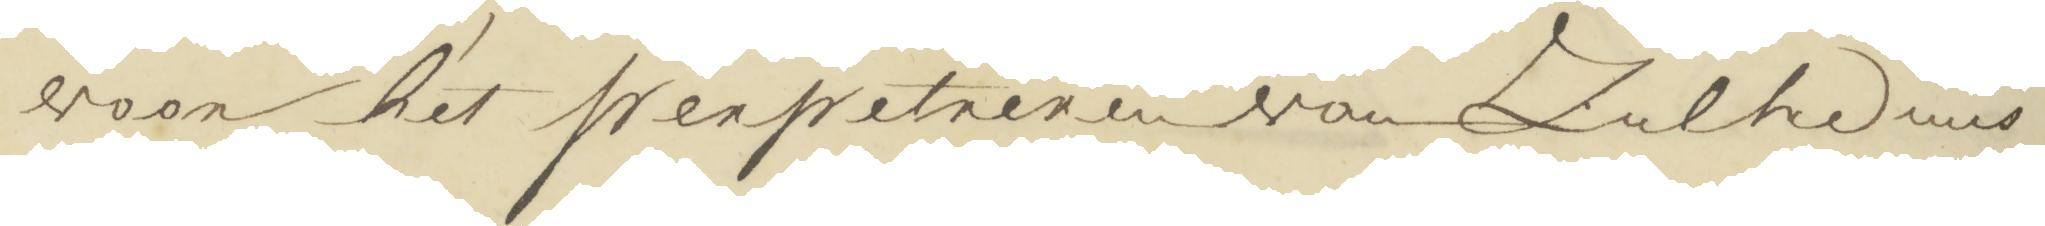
voor het perpetreren van Zulke mis
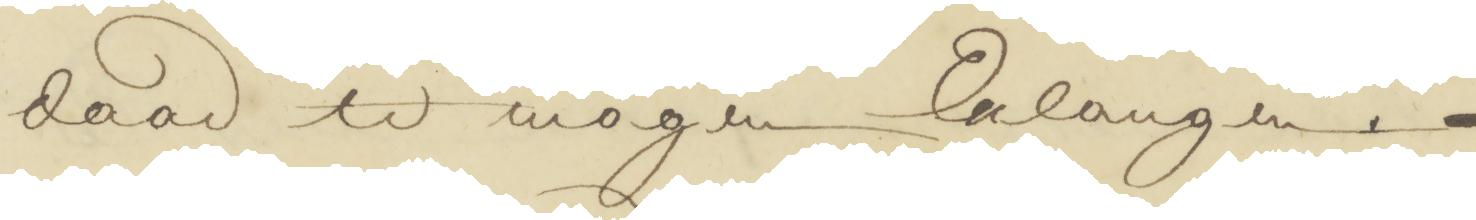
daad te mogen Erlangen.
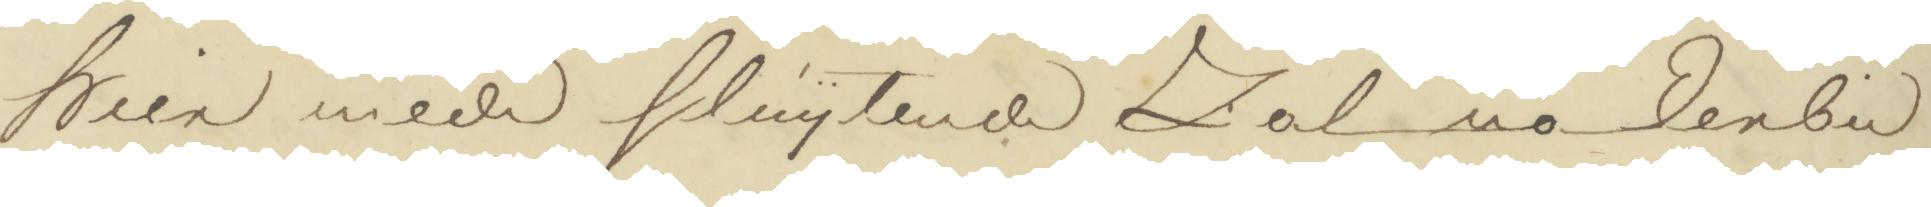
hier mede sluijtende zal na Eerbie
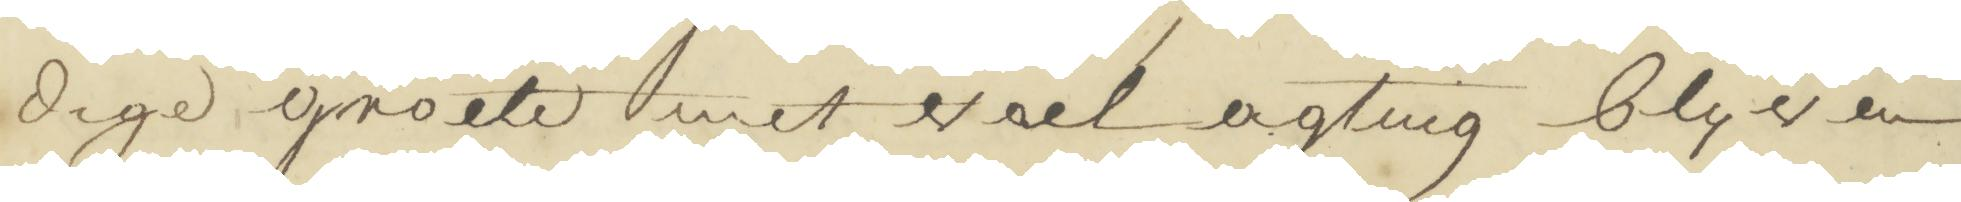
dige groete met veel agting blijven
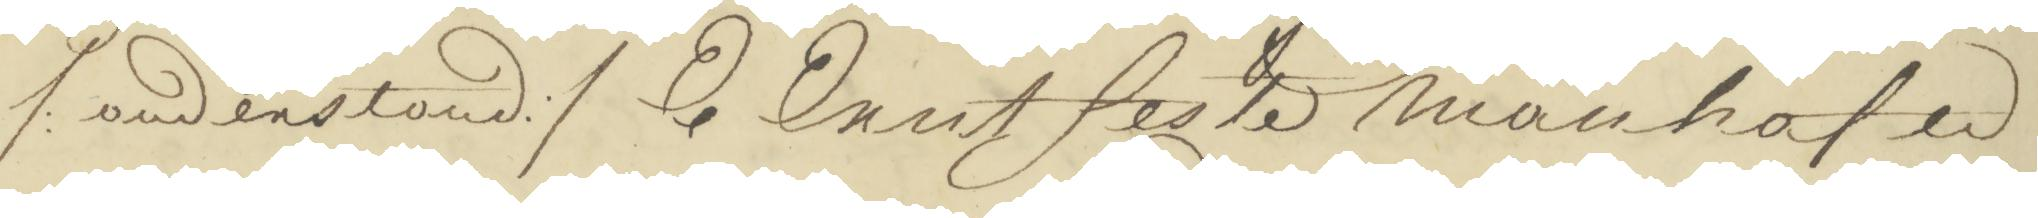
/: onderstond:/ E Erntfeste manhafte
